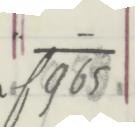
ƒ965
